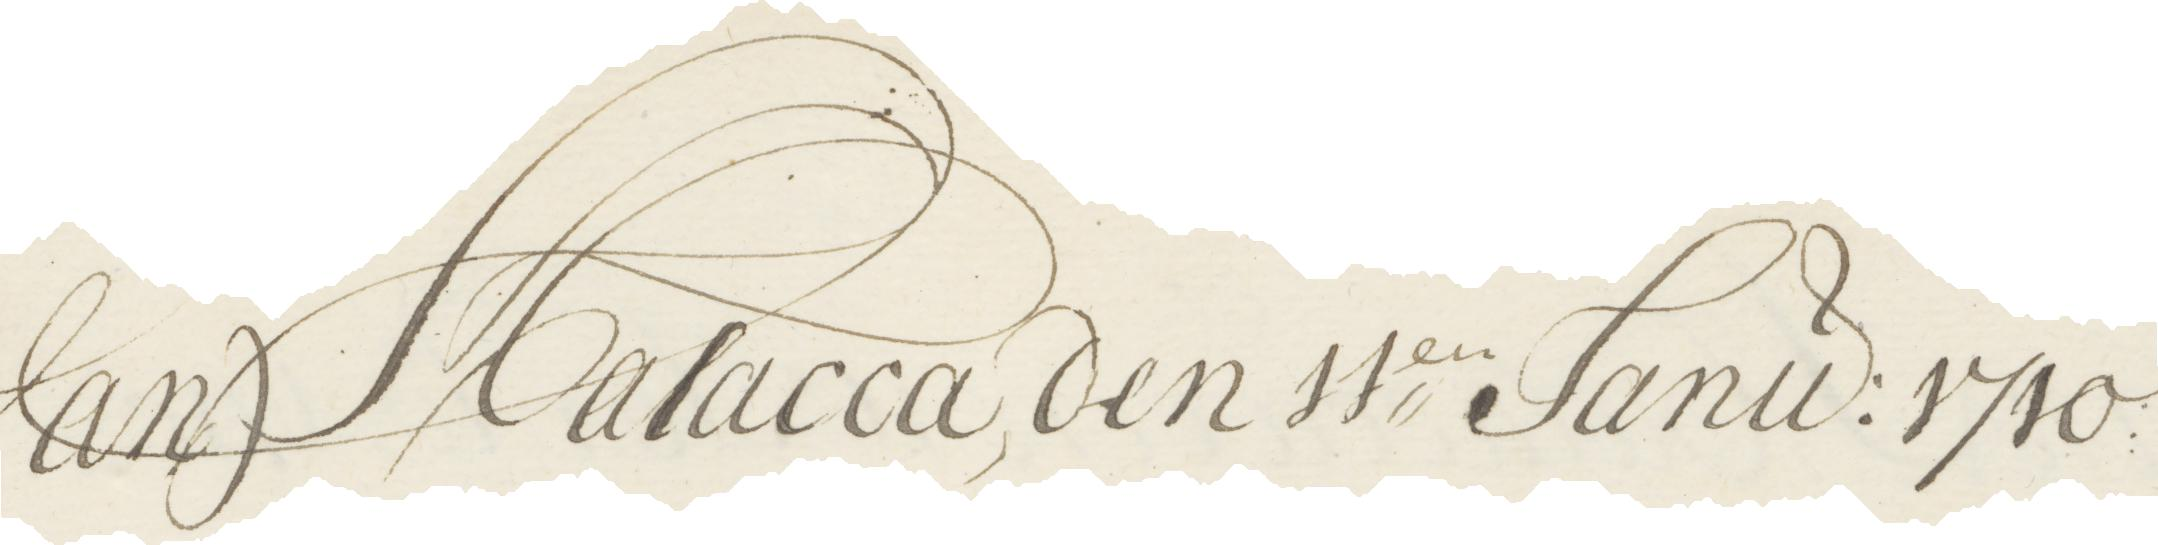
Van Malacca, den 11„en Ianu: 1710:
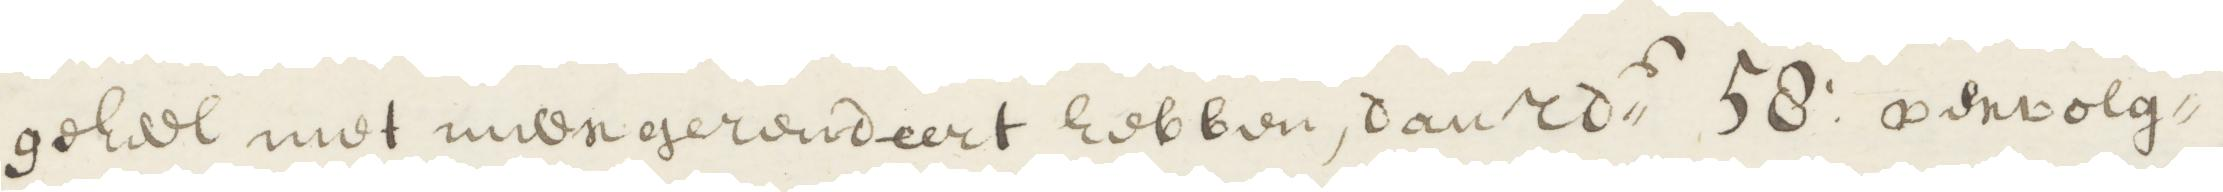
geheel niet meer gerendeert hebben, dan rd„s 58: vervolg„s
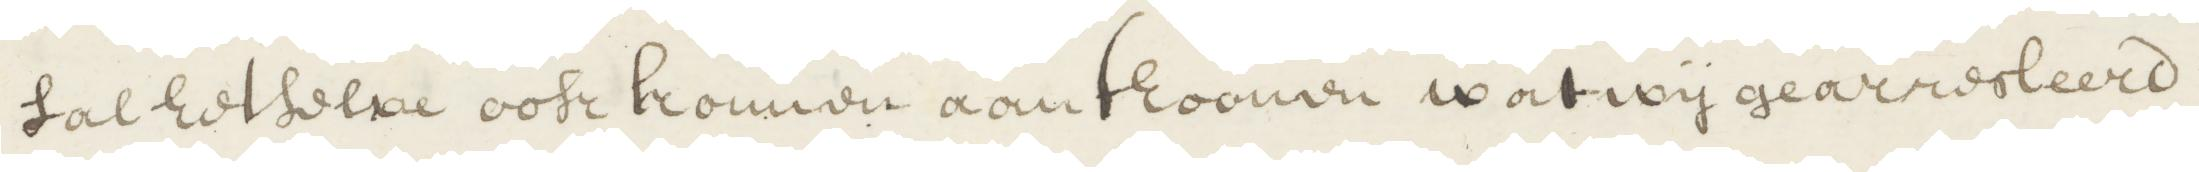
sal hetselve ook konnen aanthoonen wat wij gearresteerd
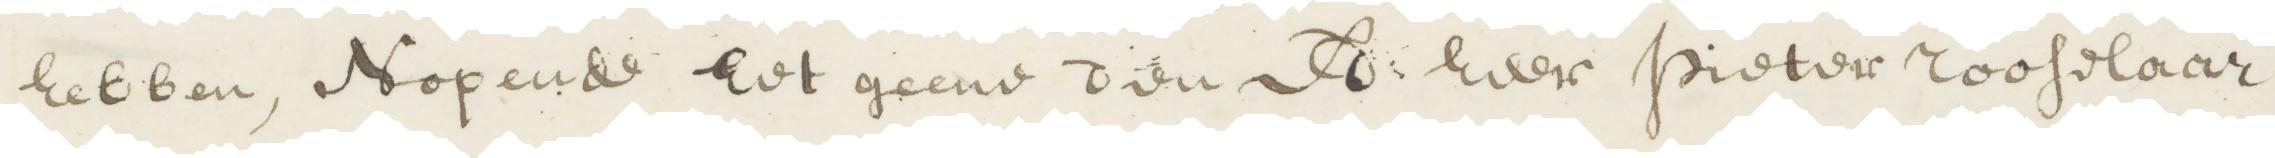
hebben, Nopende het geene den Ed: heer Pieter Rooselaar
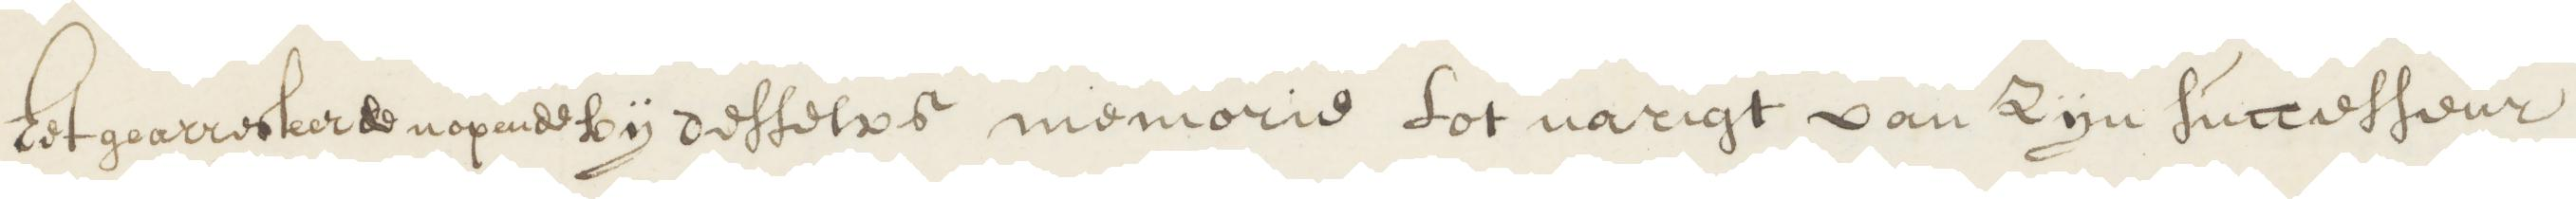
Het gearresteerde nopende bij desselvs memorie tot narigt van zijn successeur
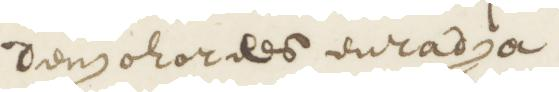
den johorees en radja
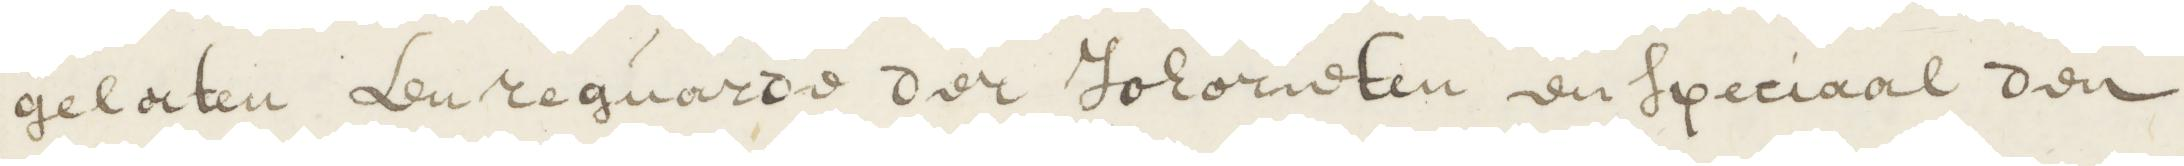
gelaten ten reguarde der Iohorieten en speciaal den
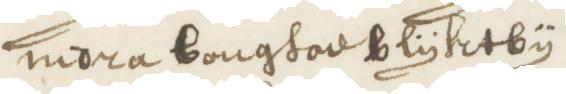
indra bongsoe blijkt bij
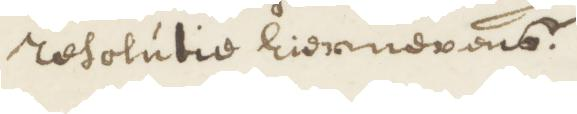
resolutie hiernevens.
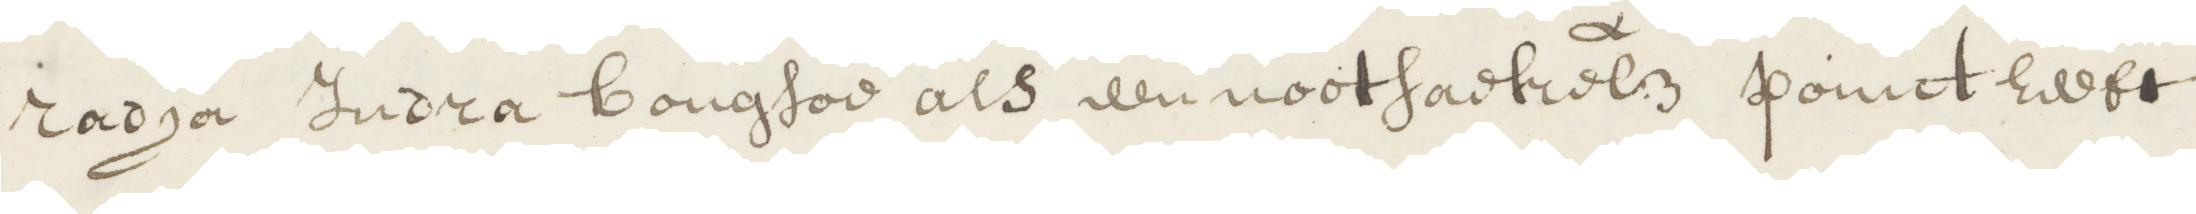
Radja Indra bongsoe als een nootsaekelijk poinct heeft
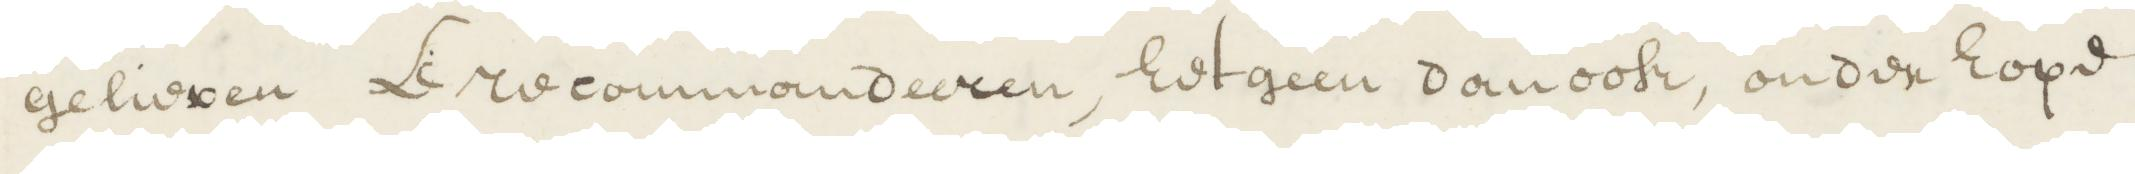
gelieven te recommandeeren, hetgeen dan ook, onder hope
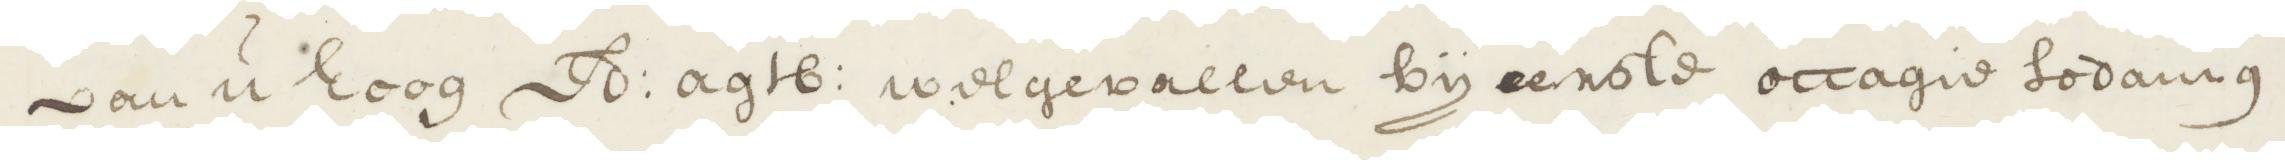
van u hoog Ed: agtb: wel gevallen bij eerste occagie sodanig
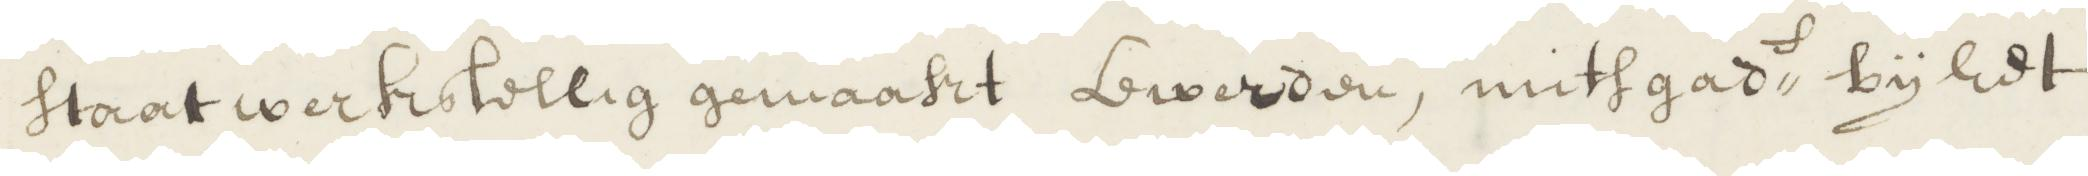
staat werkstellig gemaakt te werden, mitsgad„s bij het
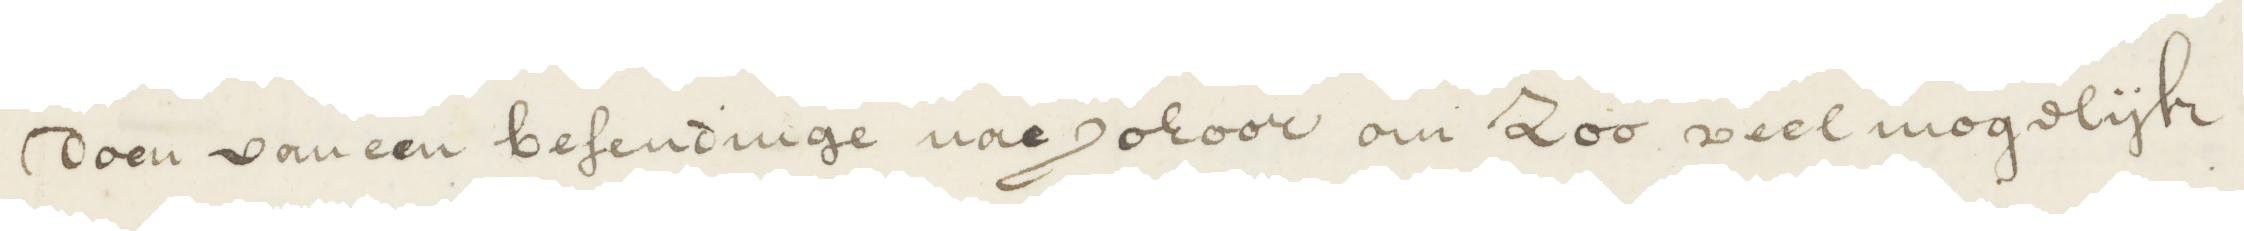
doen van een besendinge nae johoor om zoo veel mogelijk
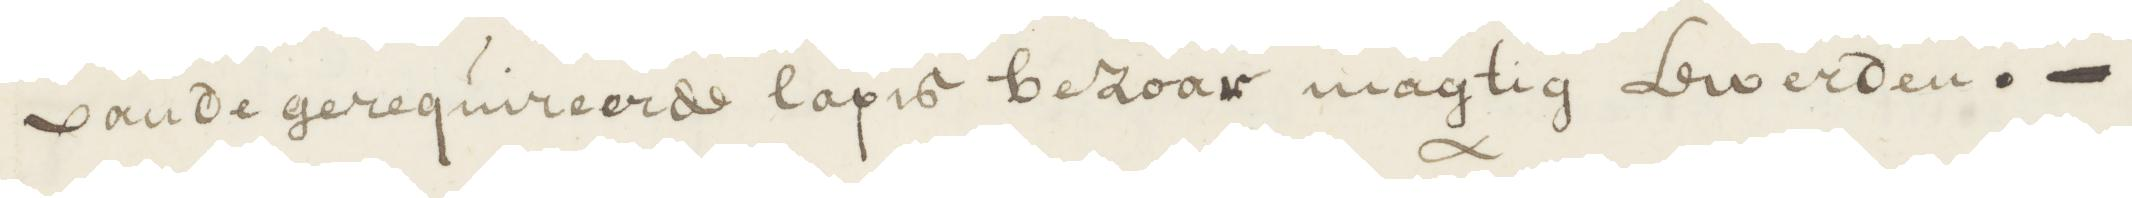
van de gerequireerde lapis bezoar magtig te werden. —
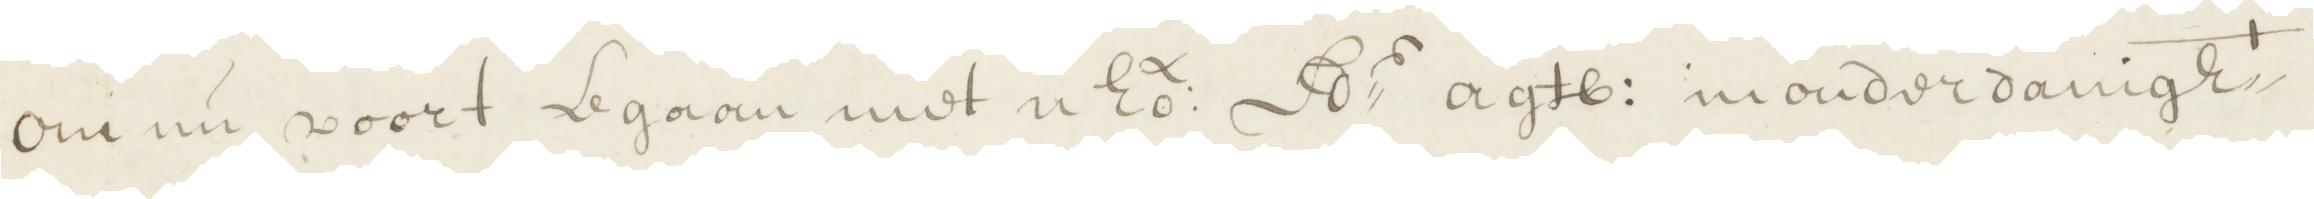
om nu voort te gaan met u ho: Ed„s agtb: in onderdanigh„t
